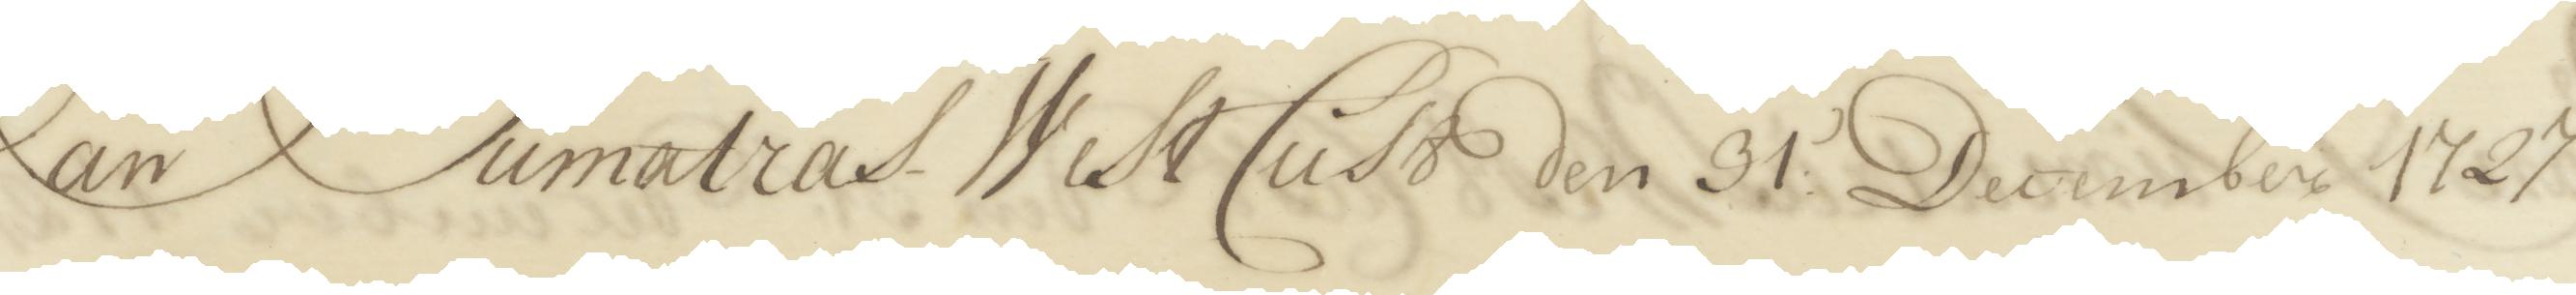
Van Sumatras West Cust den 31:' December 1727
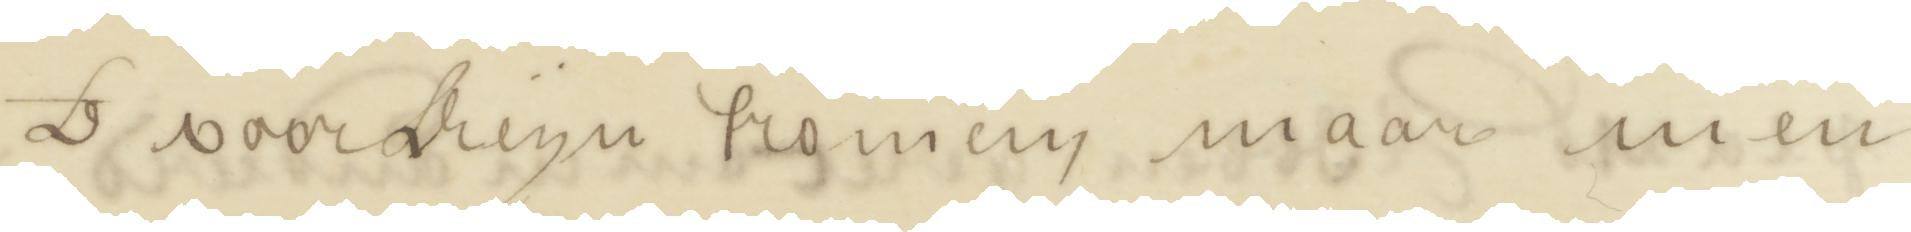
te voorscheijn komen maar men
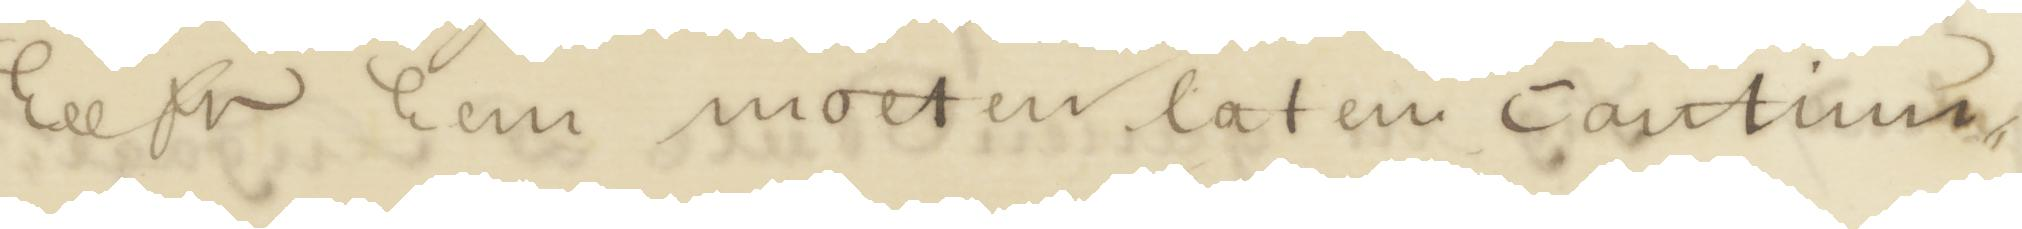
heeft hem moeten laten continu„
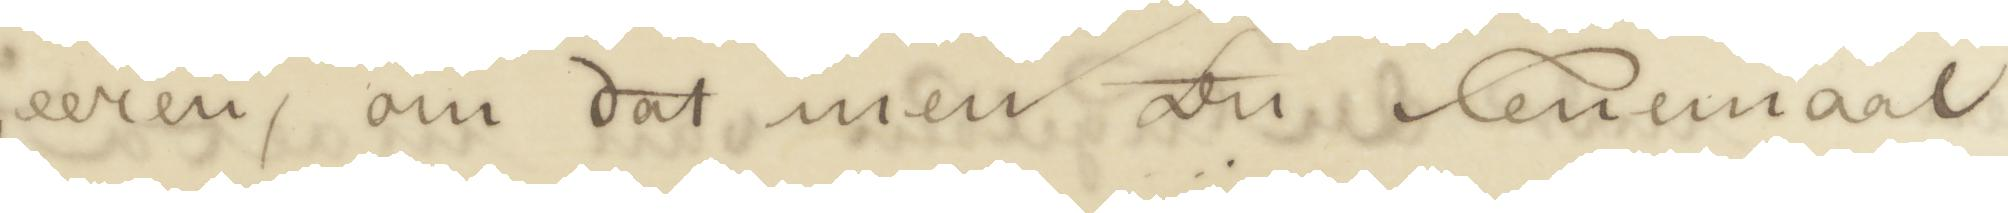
eeren, om dat men ten Eenemaal
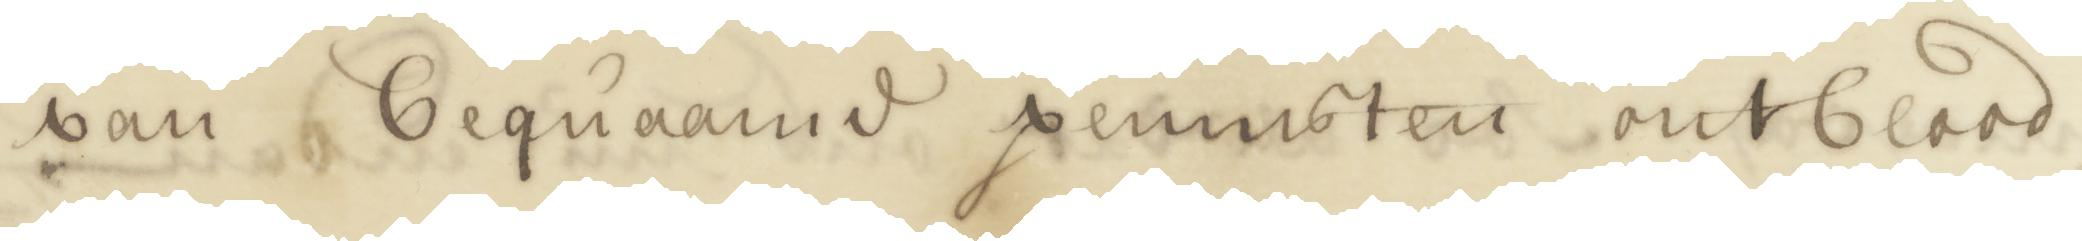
van bequaame pennisten ontblood
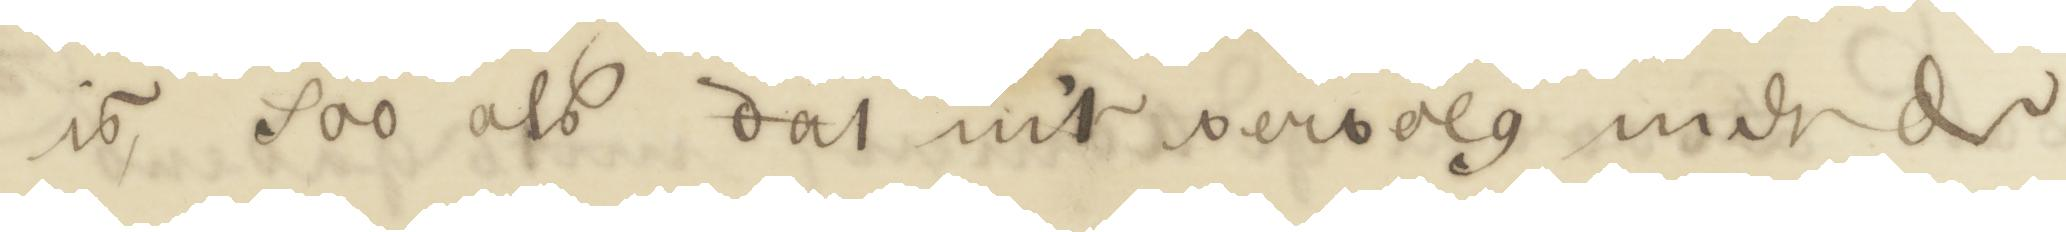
is, soo als dat in't vervolg met de
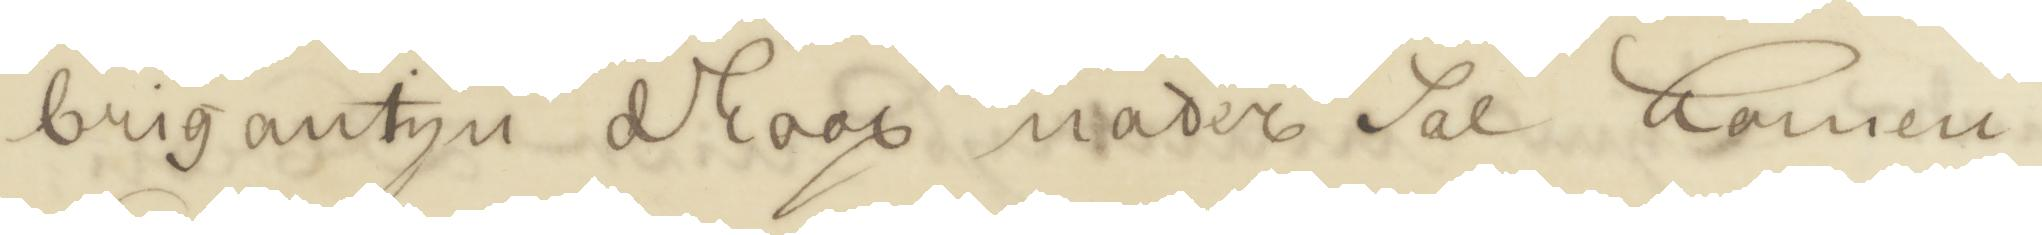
brigantijn de hoop nader sal komen
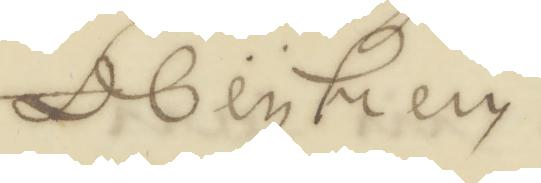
te blijken
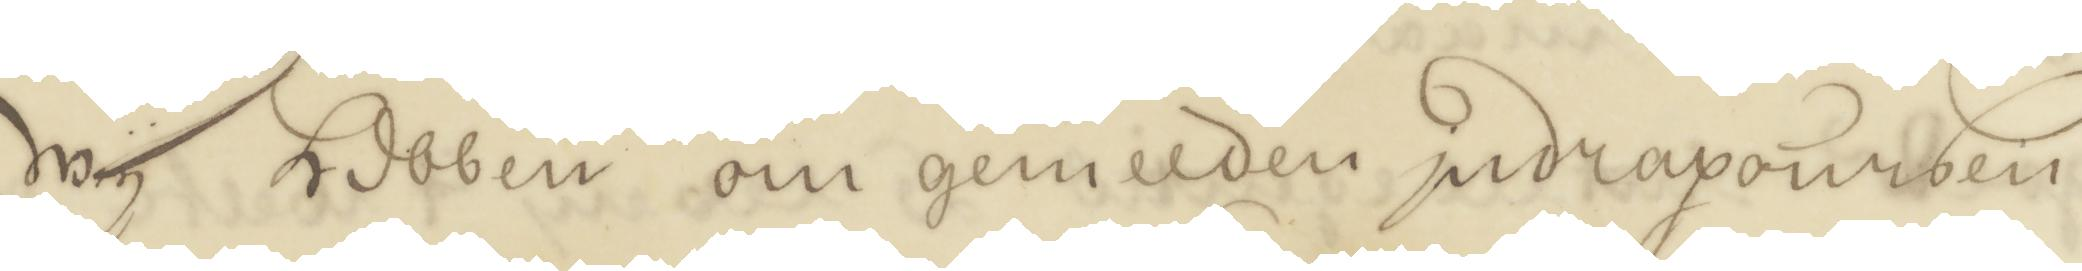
Wij hebben om gemelden jndrapoursen
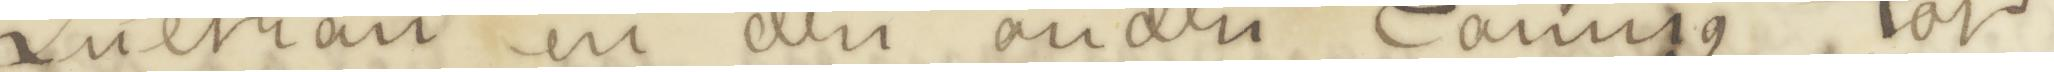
Zulthan en den ouden coning tot
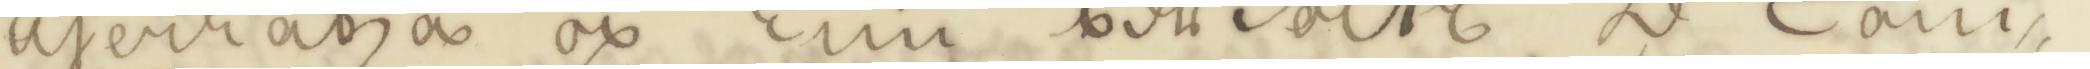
ajerhadja op hun versoek te com„
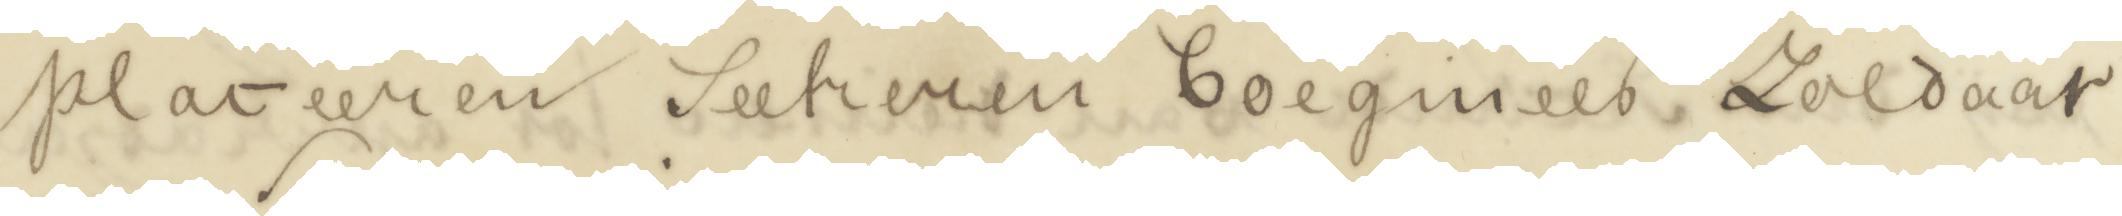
placeeren seekeren boeginees Zoldaat
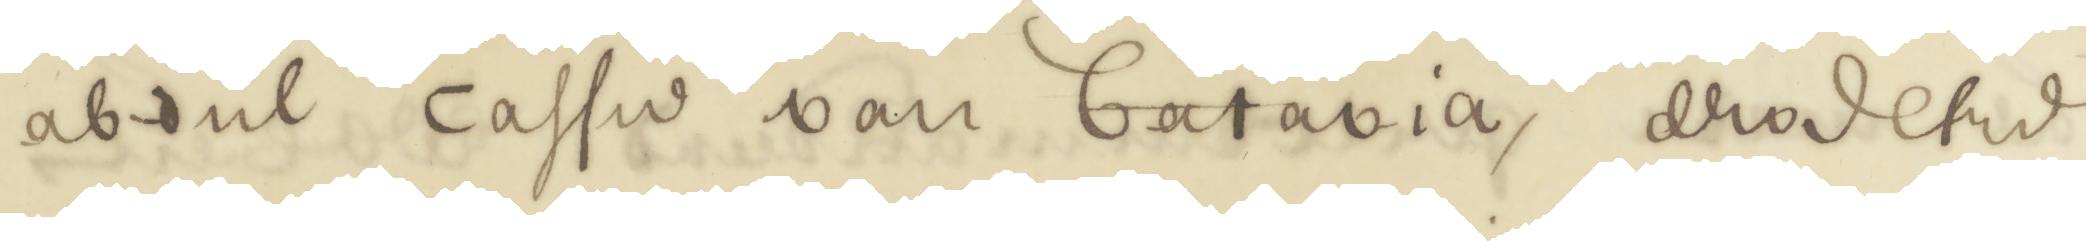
abdul cassie van batavia, dewelke
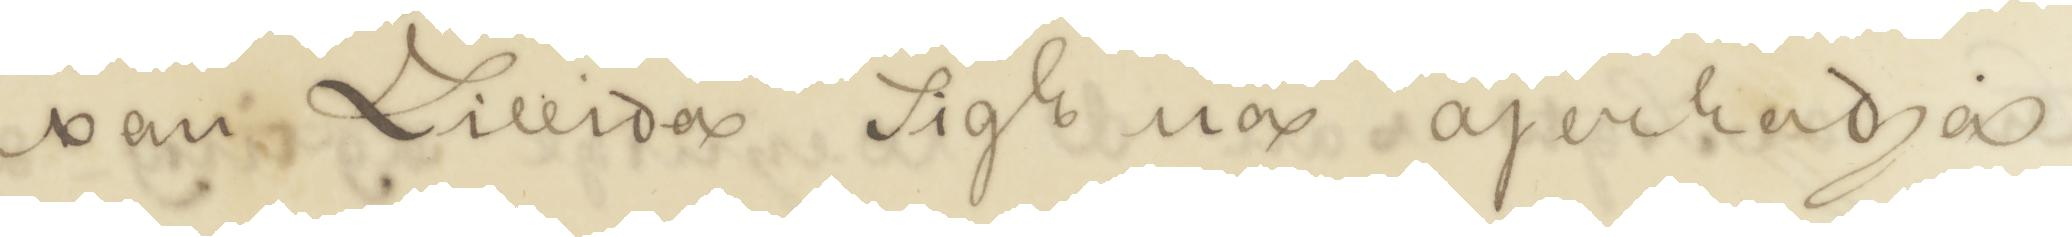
van Zillida sigh na ajerhadja
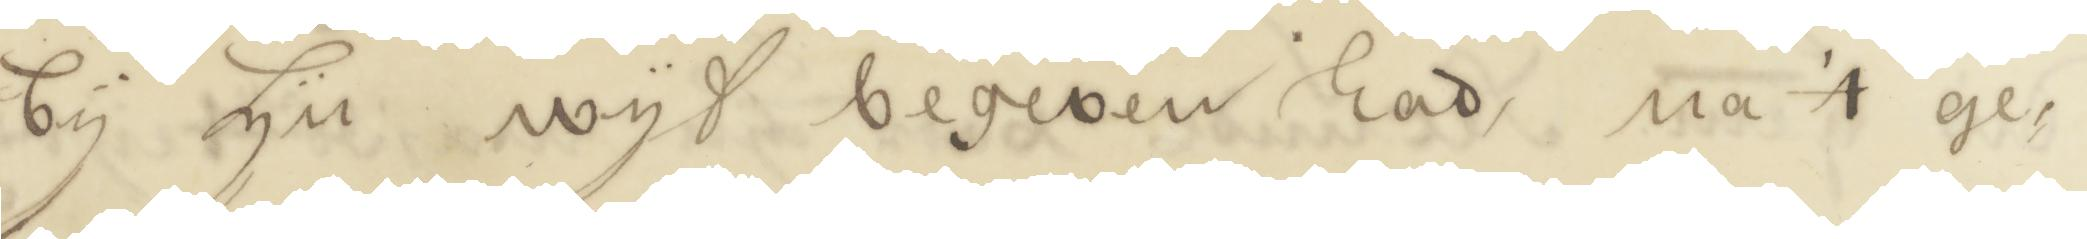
bij sijn wijf begeven had, na ’t ge„
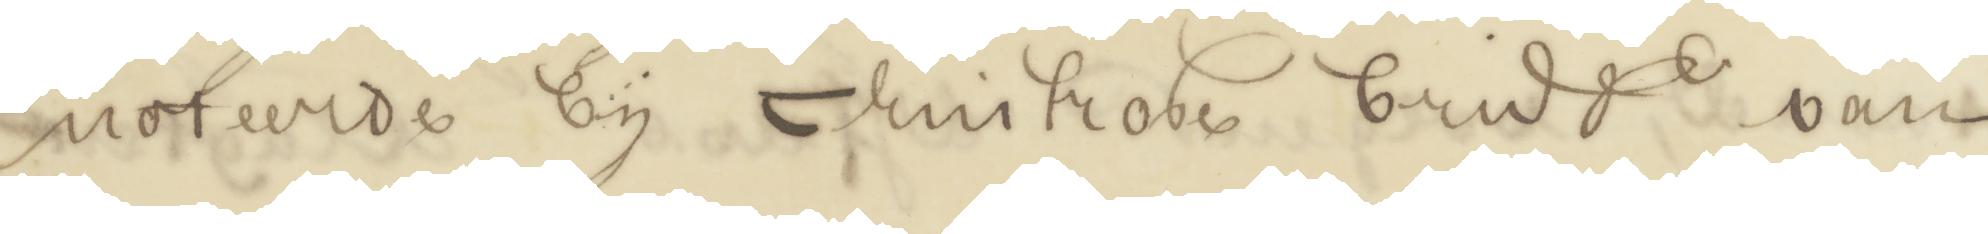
noteerde bij chinkose brief van
